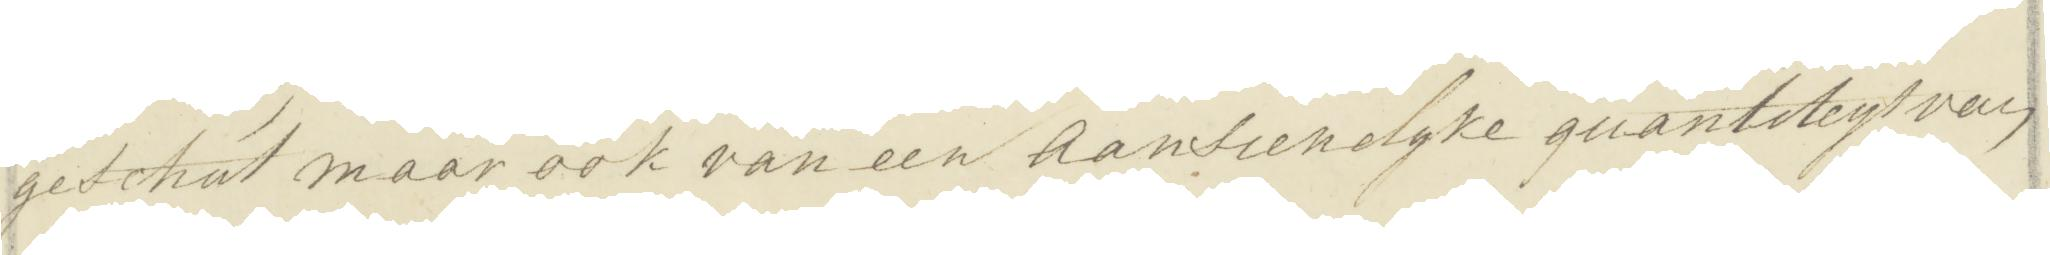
geschut maar ook van een aansienelyke quantiteyt van
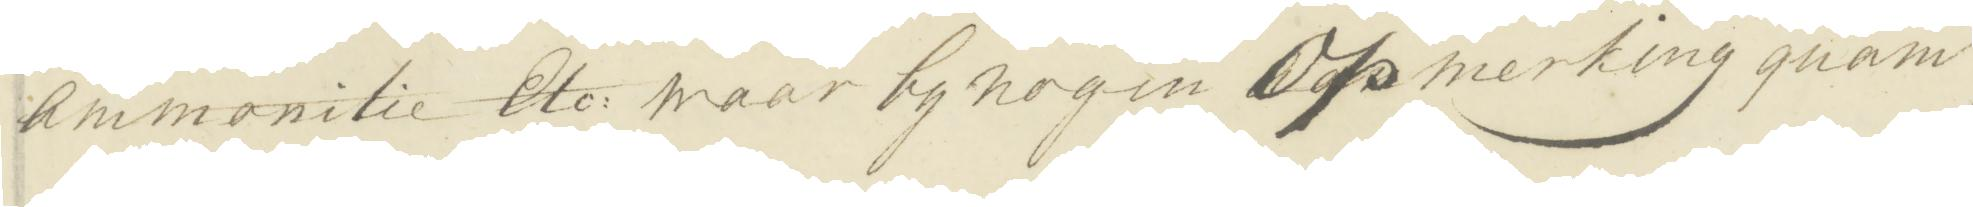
ammonitie Etc: waar by nog in opmerking quam
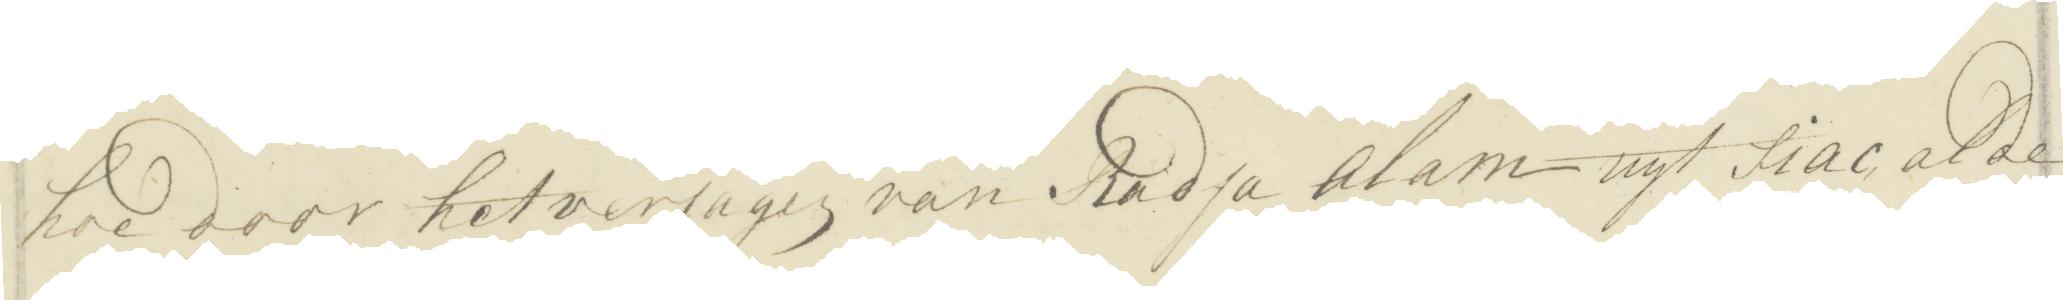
hoe door het verlagen van Radja Alam uyt siac, al de
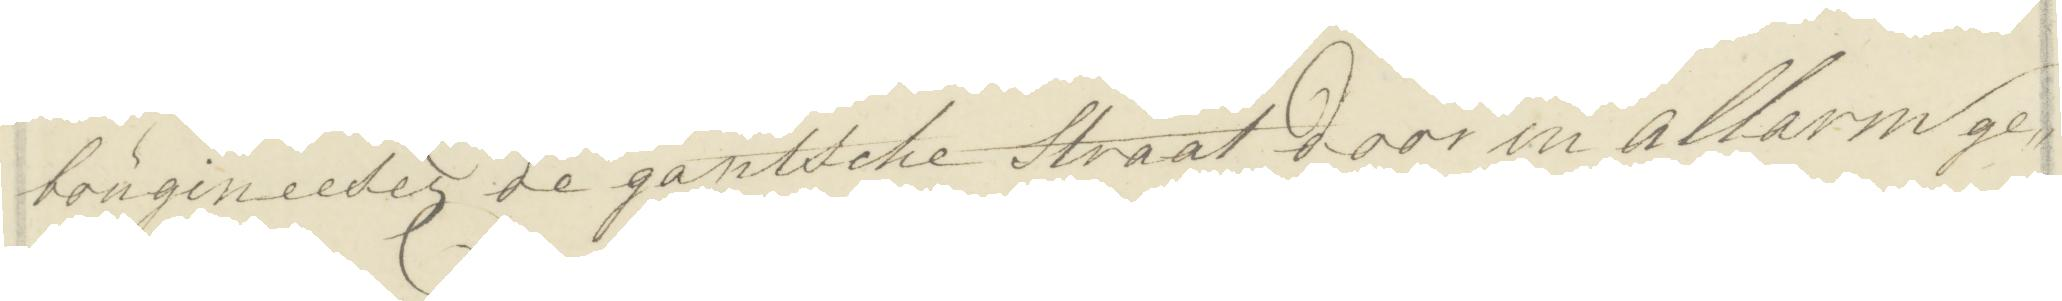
bougineesen de gantsche straat door in allarm ge„
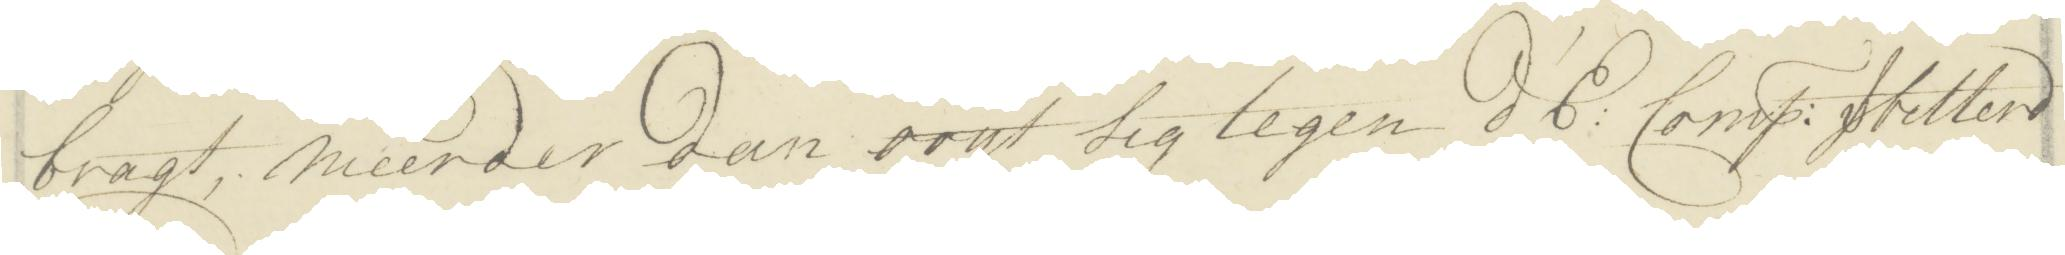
bragt, meerder dan ooyt sig tegen d'E: Comp: verbitterd
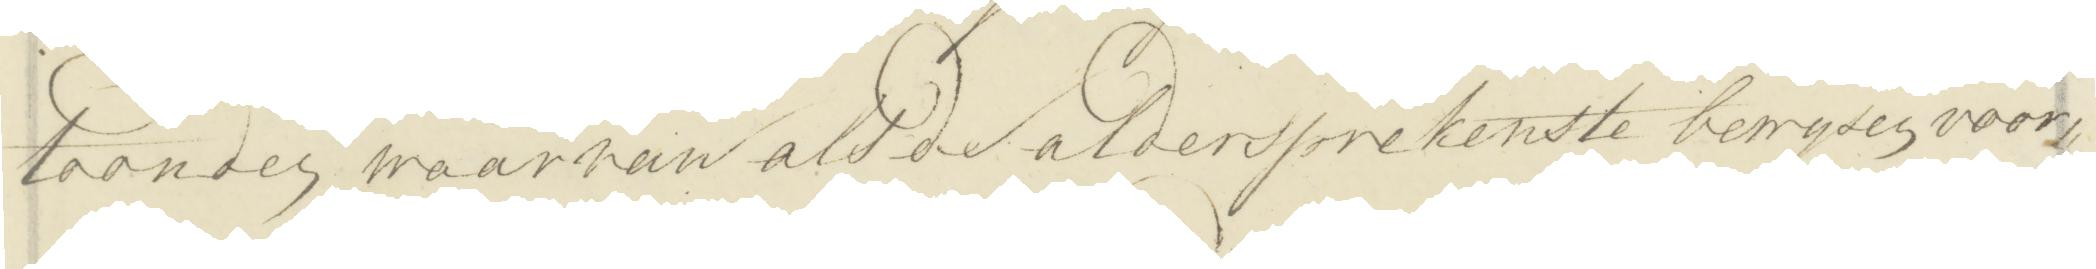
toonden waarvan als de aldersprekenste bewysen voor„
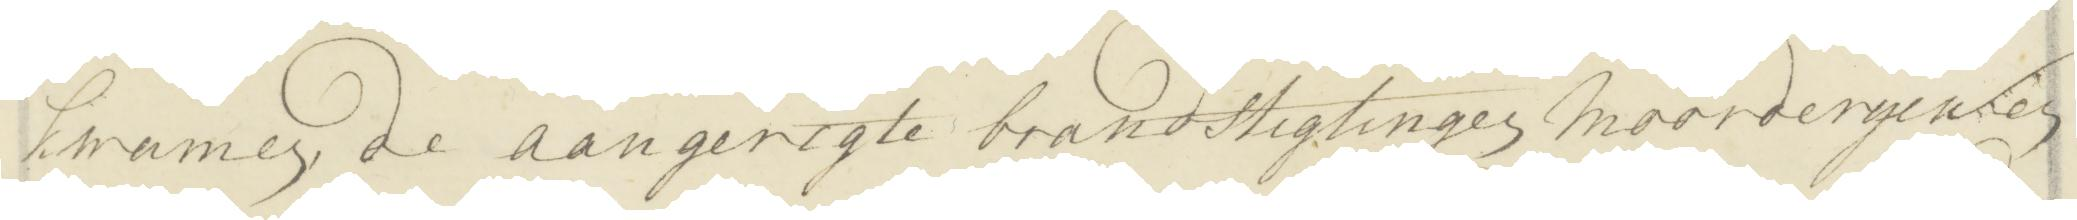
kwamen, de aangerigte brandstigtingen moorderyen en
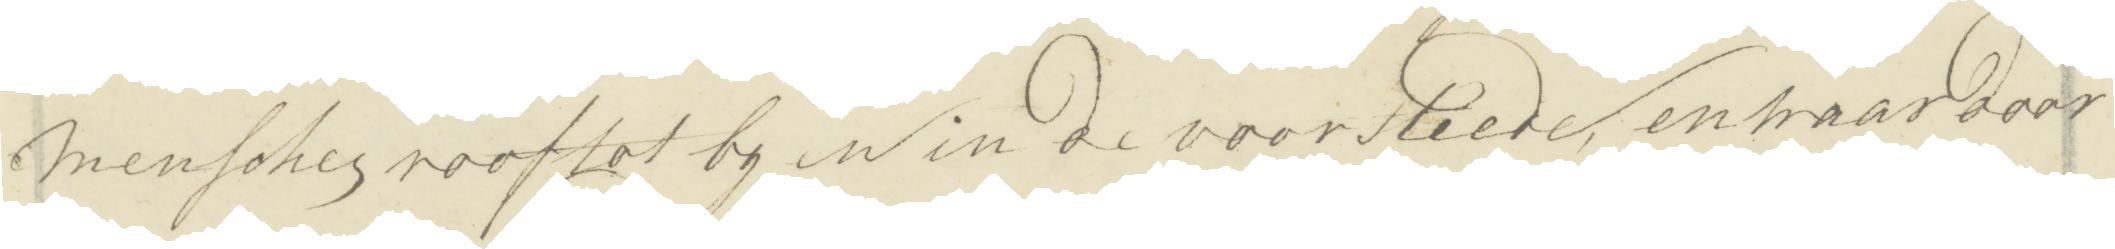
menschen roof tot by u in de voorsteede, en waardoor
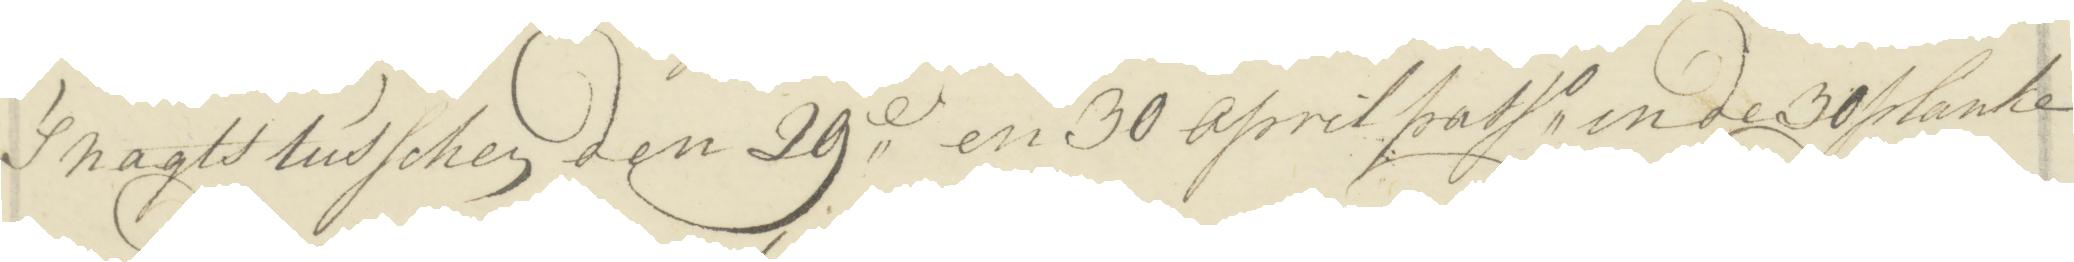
's nagts tusschen den 29„e en 30 april pass„o in de 30 planke
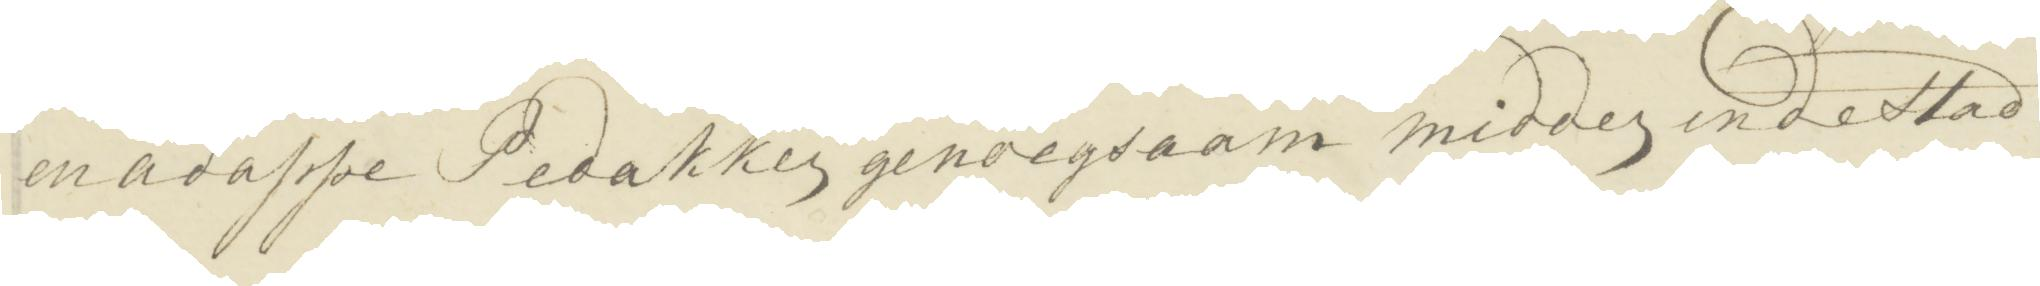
en adappe Pedakken genoegsaam midden in de stad
